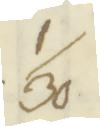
1/30
